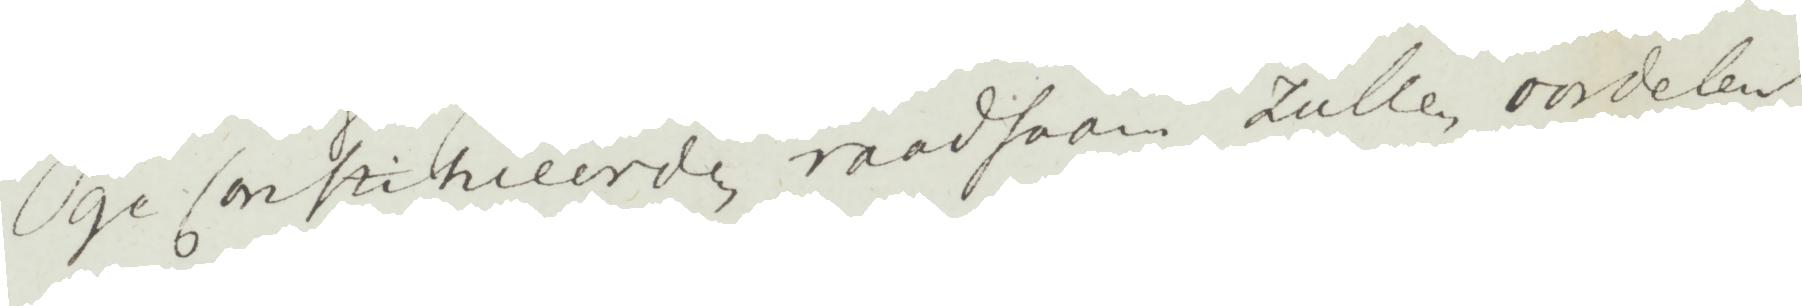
geconstitueerden raadsaam zullen oordelen
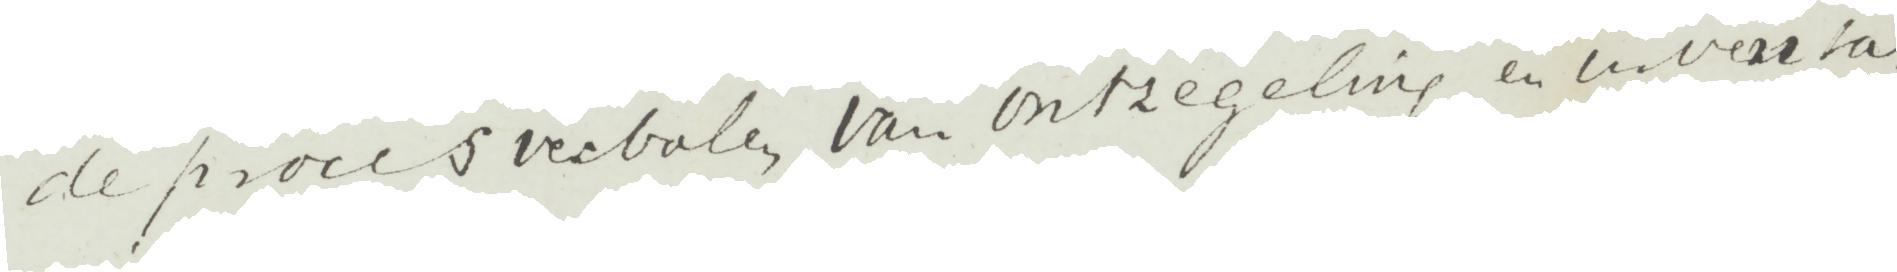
de proces verbalen van ontzegeling en inventa
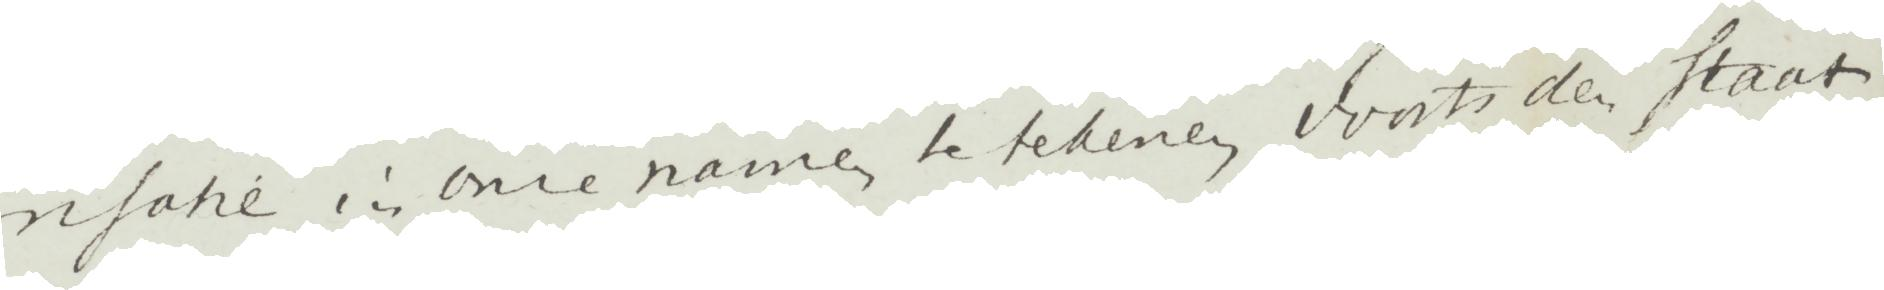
risatie in onze namen te tekenen voorts den staat
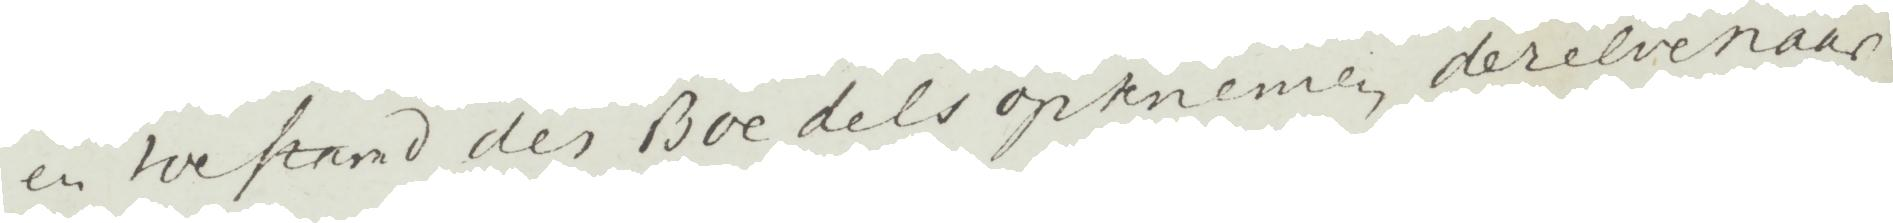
en toestand des Boedels optenemen dezelve naar
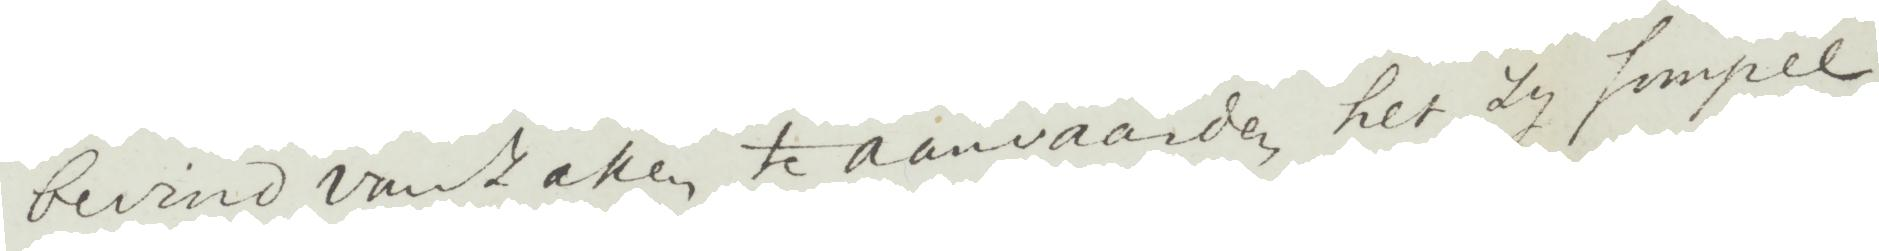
bevind van zaken te aanvaarden het zy simpel
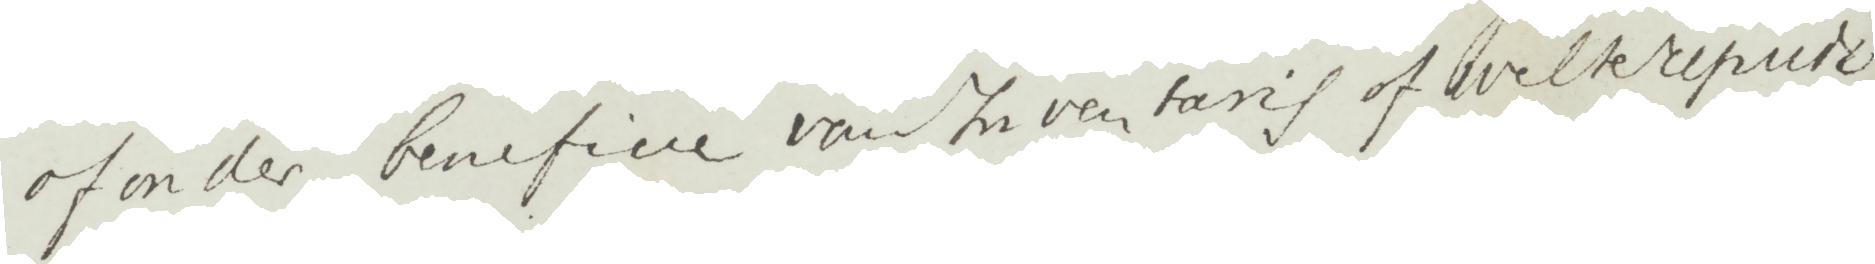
of onder benificie van Inventaris of wel te repudi
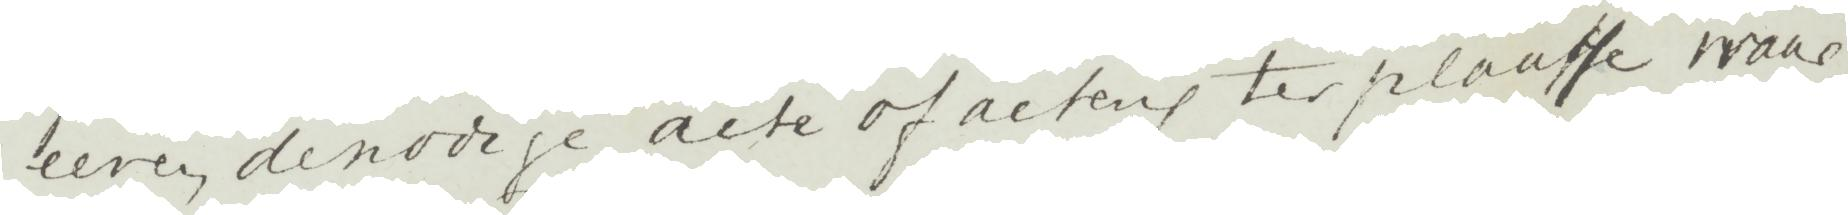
eeren de nodige acte of actens ter plaatse waar
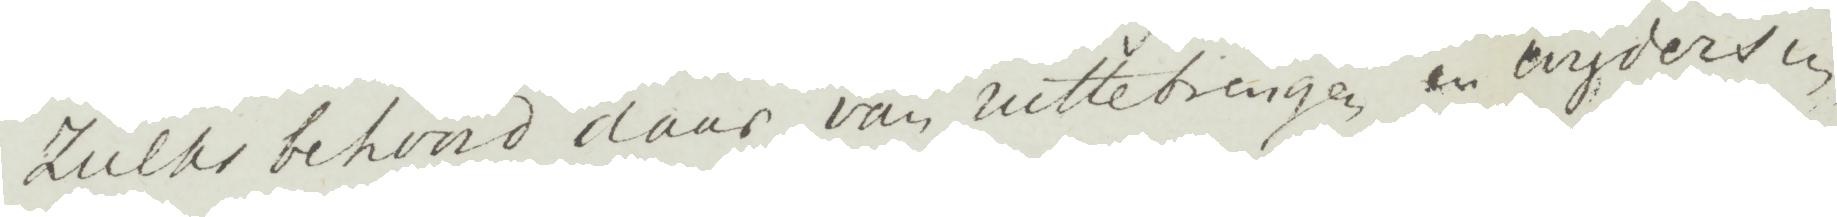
zulks behoord daar van uittebrengen en wyders in
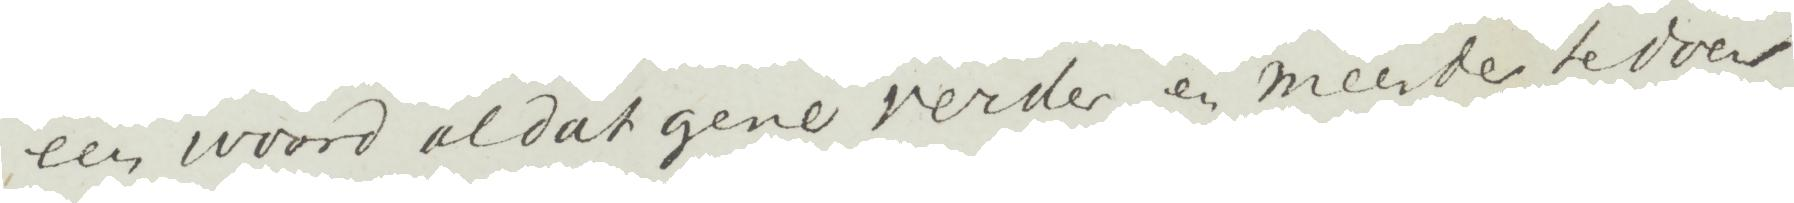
een woord al dat gene verder en meerder te doen
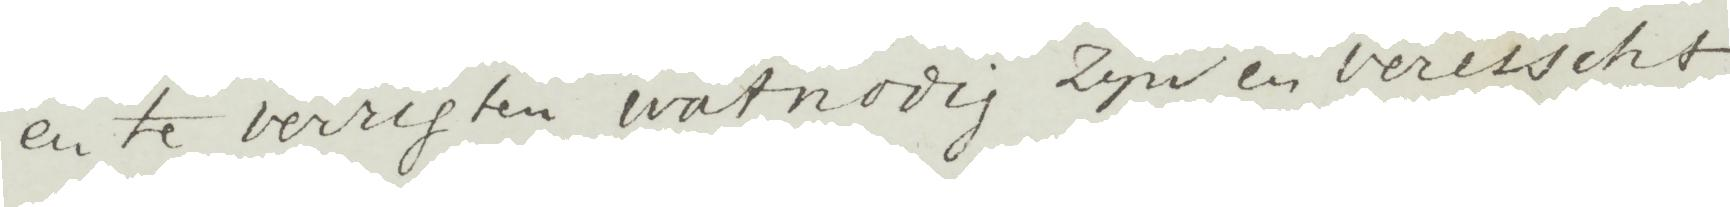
en te verrigten wat nodig zyn en vereischt
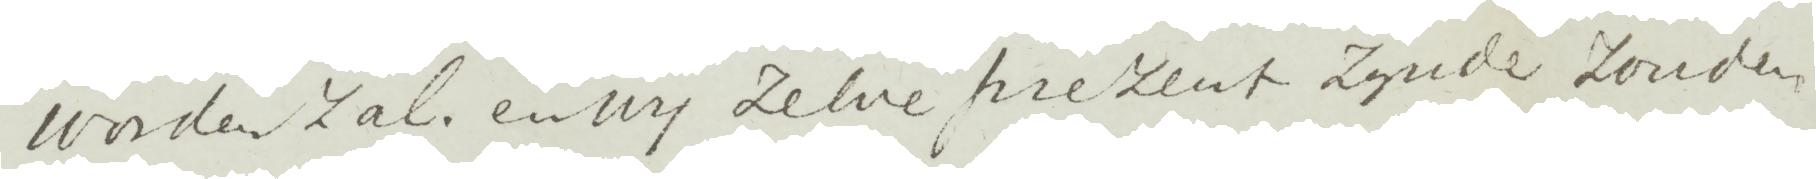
worden zal, en wy zelve prezent zynde zouden
